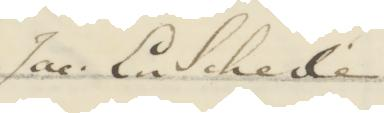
Jac. Enschedé
